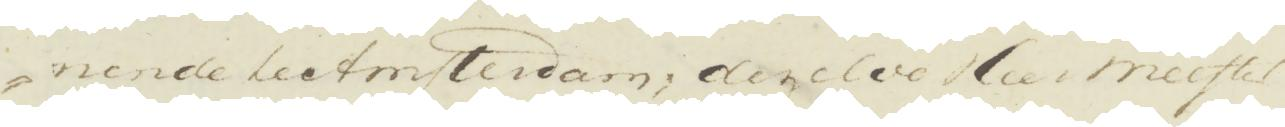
=nende te Amsterdam; dezelve Heer Meester
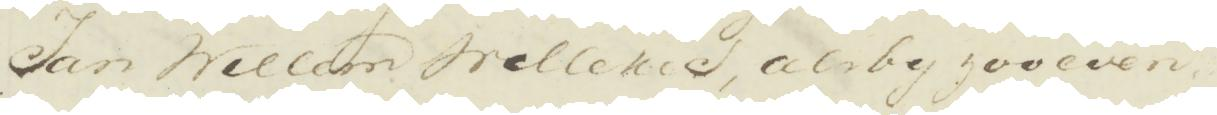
Ian Willem Wellekes, als bij zoo even„
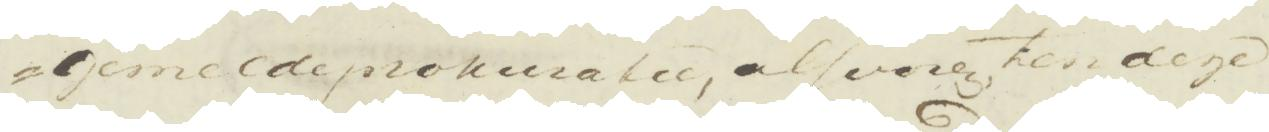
=gemelde prokuratie, alsvoren, ten deze
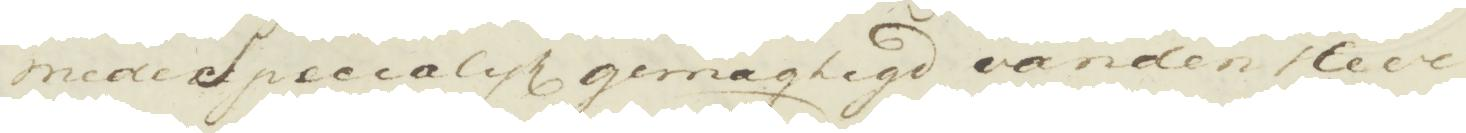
mede Specialyk gemagtigd vanden Heer
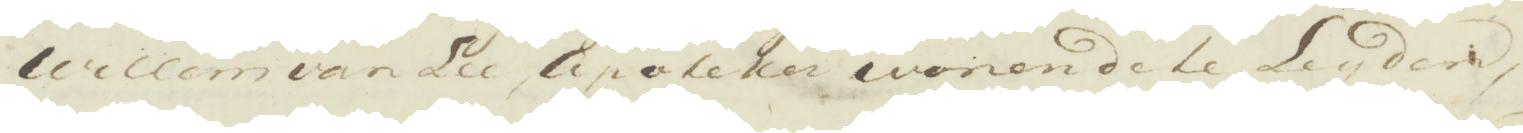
Willem van Lee, Apoteker wonende te Leyden,
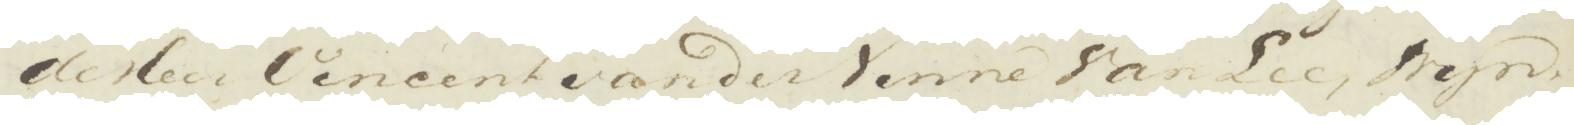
de Heer Vincent van der Venne van Lee, Wyn
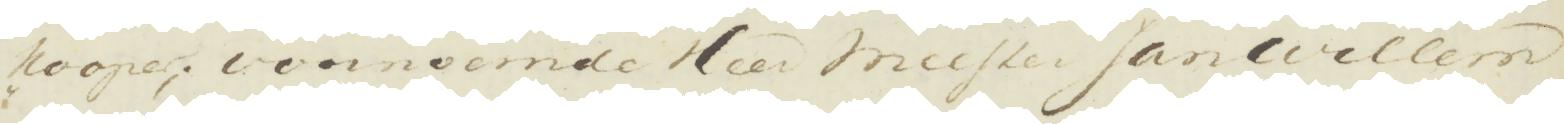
„kooper, voornoemde Heer Meester Jan Willem
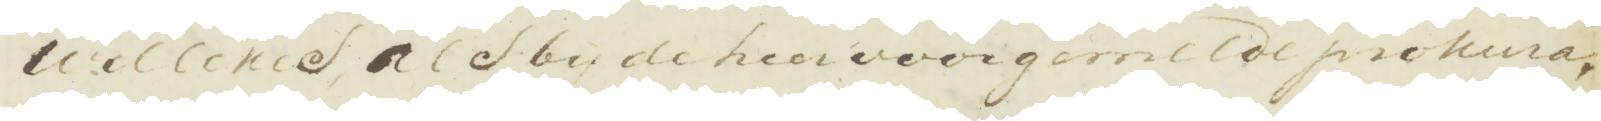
Wellekes, als by de hier voorgemelde prokura„
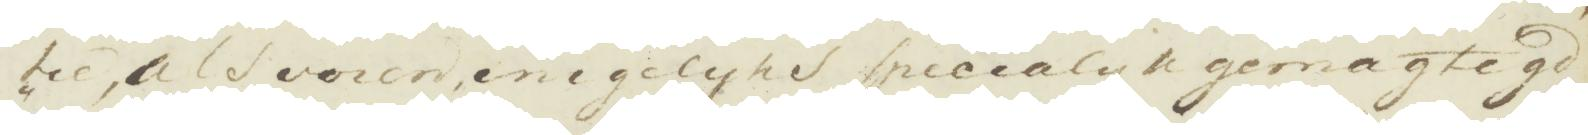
„tie, als voren, enigelyks specialyk gemagtigd
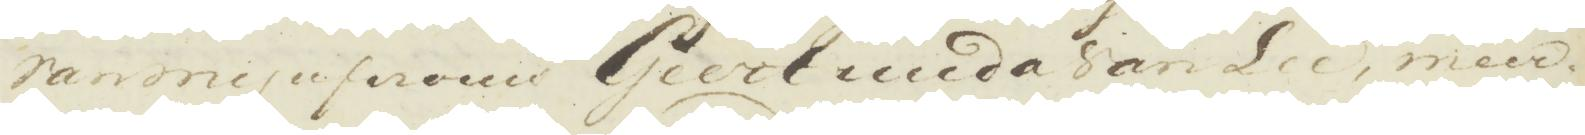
van mejufvrouw Geertruida van Lee, meer„
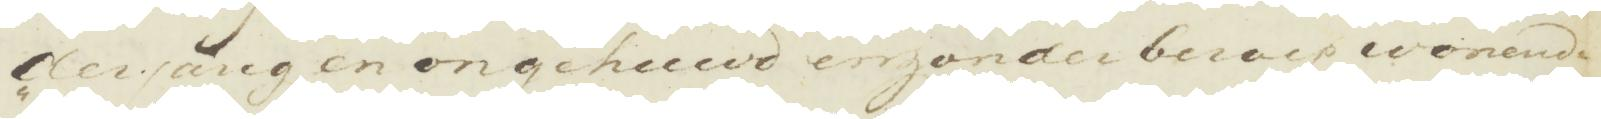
„derjarig en ongehuwd en zonder beroep wonende
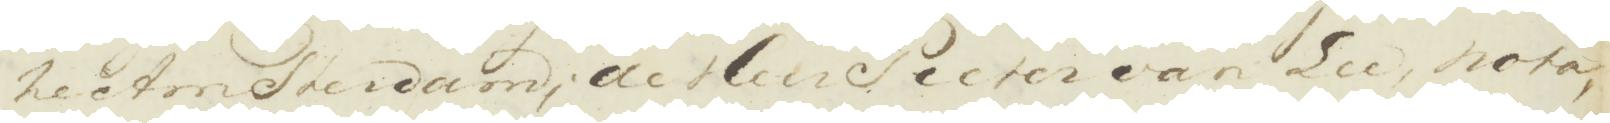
te Amsterdam; de Heer Pieter van Lee, Nota„
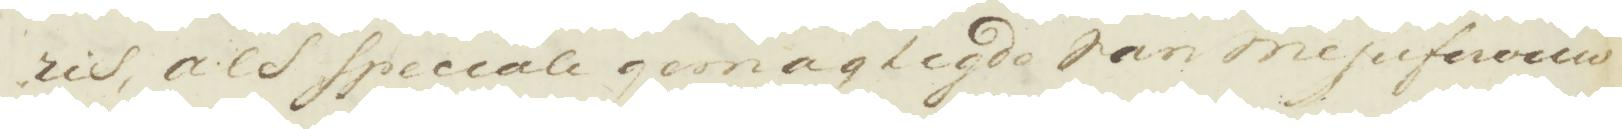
„ris, als speciale gemagtigde van mejufvrouw
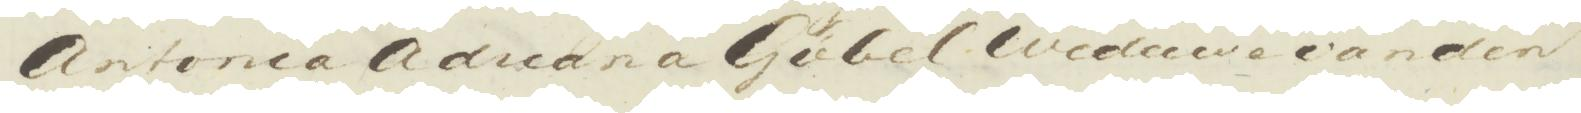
Antonia Adriana Göbel Weduwe van den
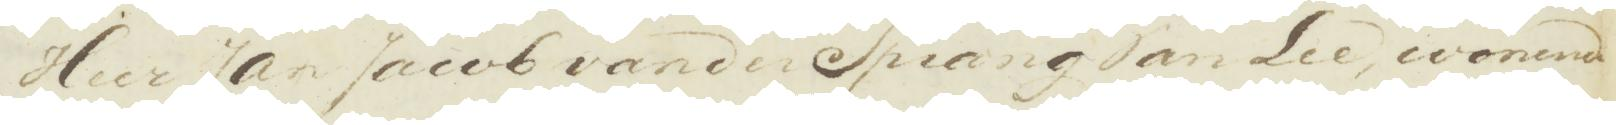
Heer Jan Jacob van der Sprang Van Lee, wonende
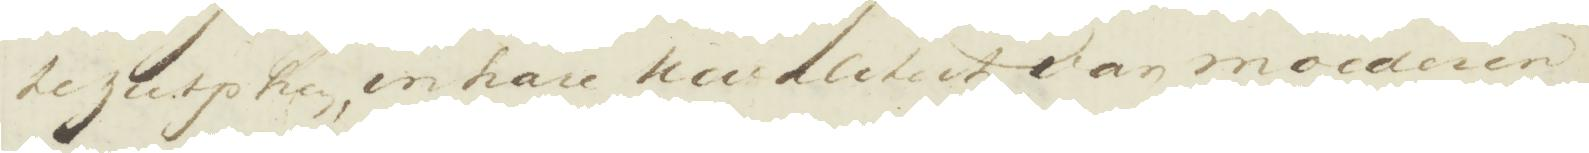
te Zutphen, in hare kwaliteit van moederen
